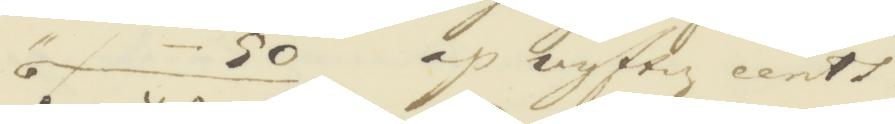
„ — 50 op vyftig cents
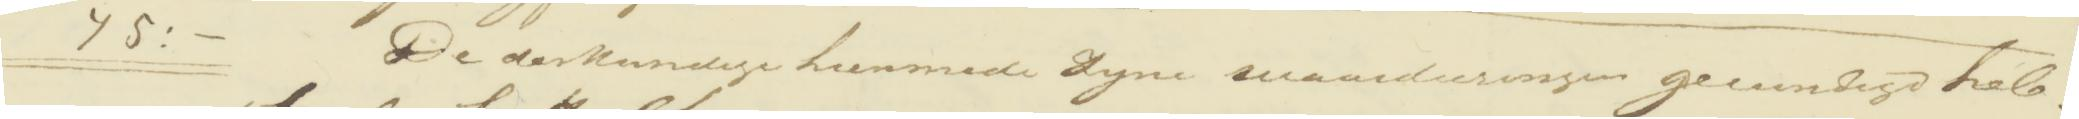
75: – De deskundige hiermede zyne waardeeringen gecundigd heb.
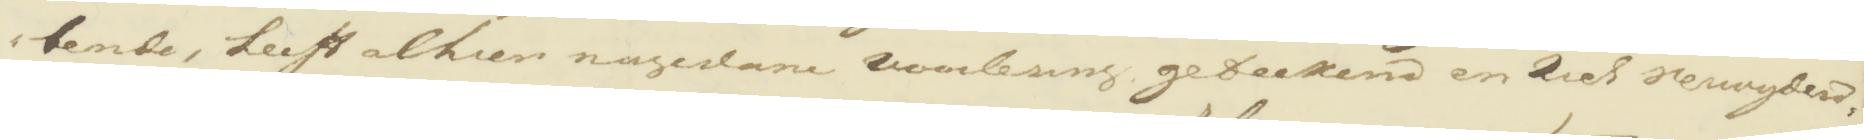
„bende, heeft alhier nagedane voorlezing geteekend en zich verwyderd
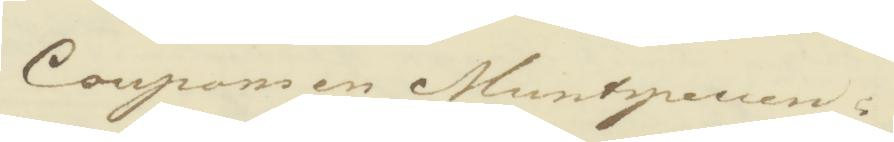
Coupons en Muntspecien:
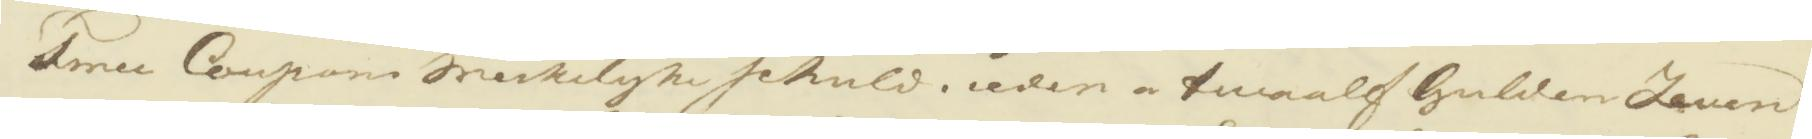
Twee Coupons werkelyke schuld, ieder en twaalf Gulden Zeven
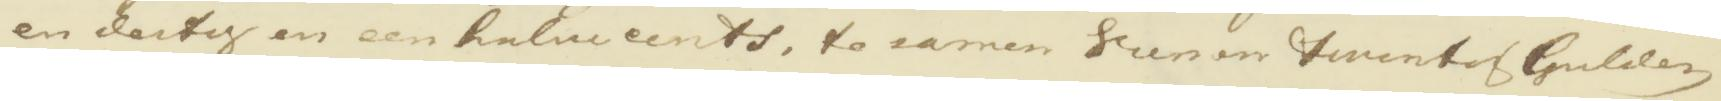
en dertig en een halve cents, te zamen vier en zeventig Gulden
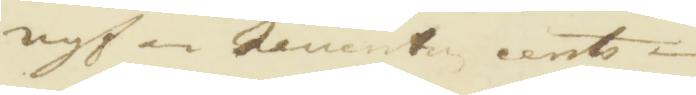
vyf en zeventig cents
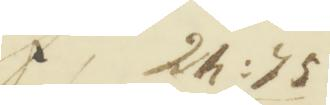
ƒ 24:75
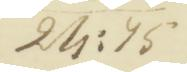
24:75
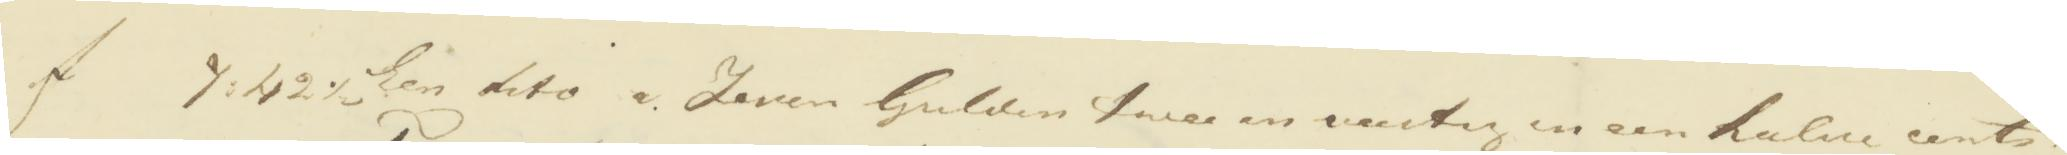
ƒ 7: 42½ Een dito a. Zeven Gulden twee en veertig en een halve cents
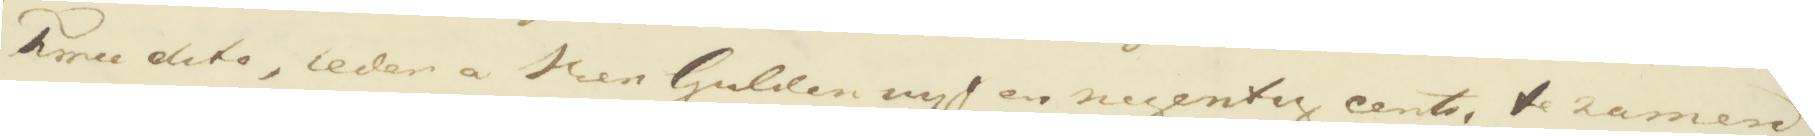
Twee dito, ieder a Vier Gulden vyf en negentig cents, te zamen
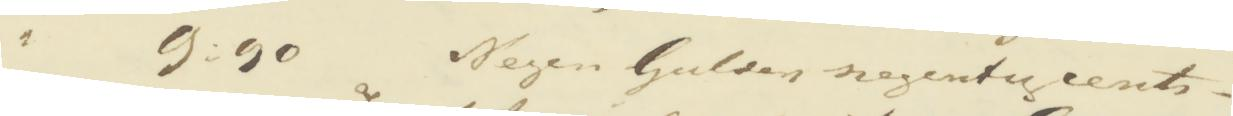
„ 9:90 Negen Gulden negentig cents
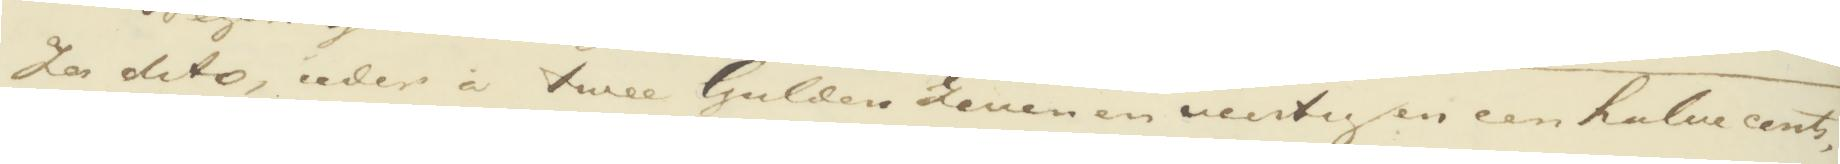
Zes dito, ieder à twee Gulden Zeven en veertig en een halve cents
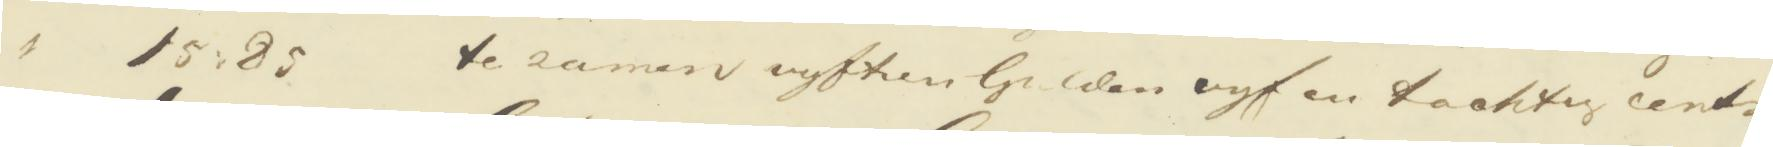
„ 15:85 te zamen vyftien Gulden vyf en tachtig cents
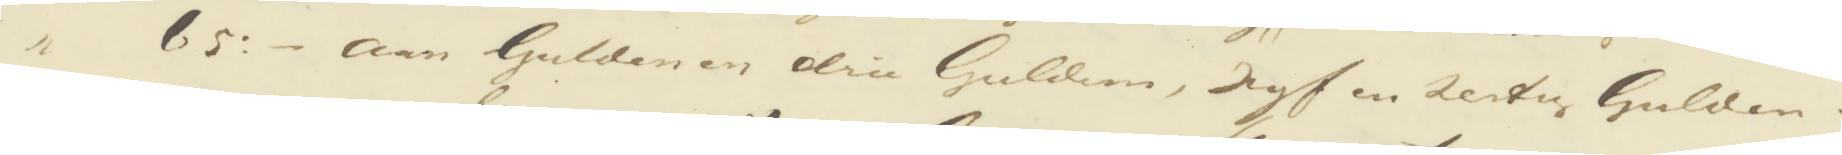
„ 65: – aan Gulden en drie Guldens, vyf en zestig Gulden
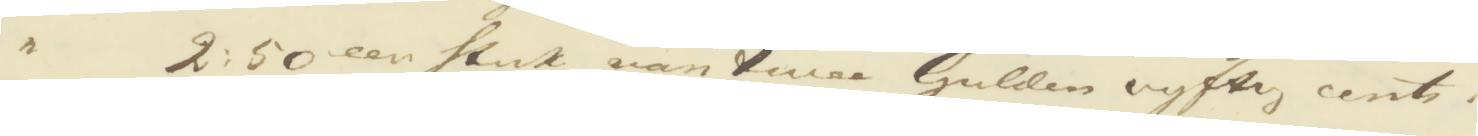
„ 2: 50 een stuk van twee Gulden vyftig cents
